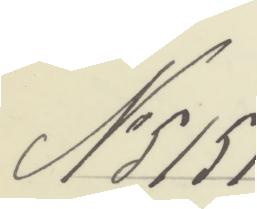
No 5151
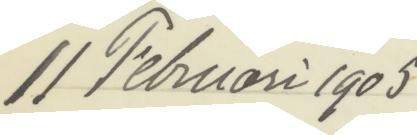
11 Februari 1905
